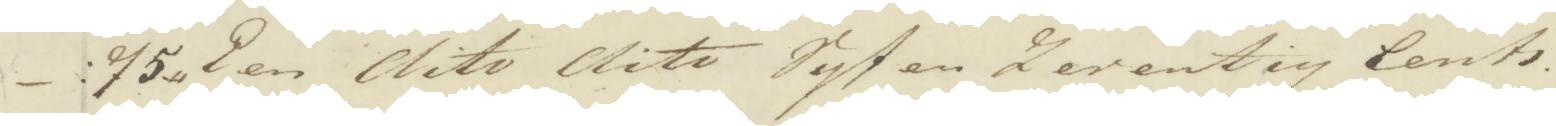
—:75„ Een dito dito Vyf en Zeventig Cents
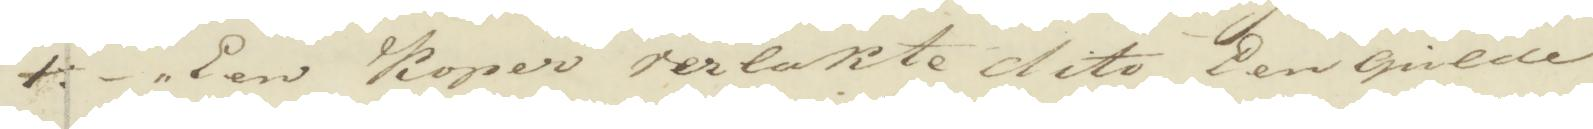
1:— „ Een Koper verlakte dito Een gulde
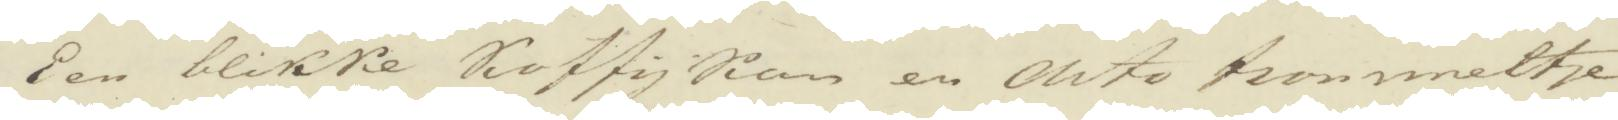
Een blikke koffij kan en dito trommeltje
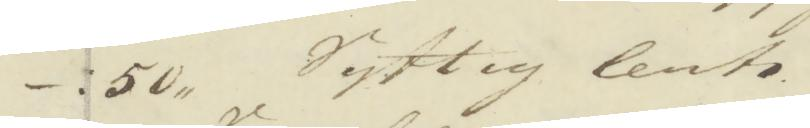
—: 50„ Vyftig Cents
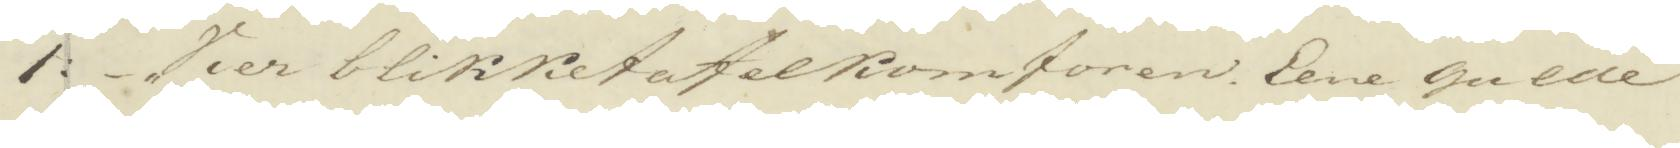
1: — Vier blikketafelkomforen Eene gulde
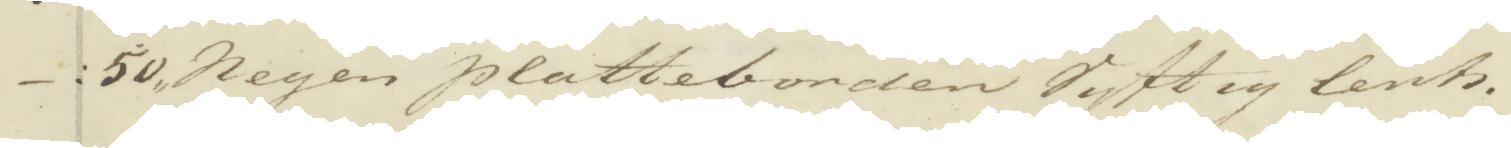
—:50„ Negen platteborden Vyftig Cents.
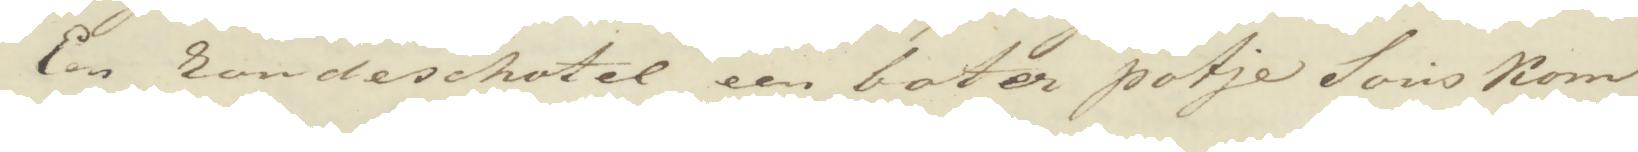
Een rondeschotel een boter potje Sous kom
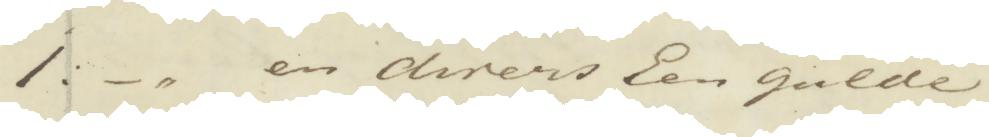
1: — „ en divers Een gulde
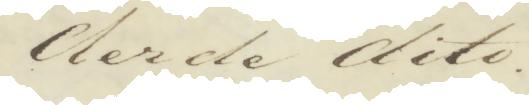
derde dito.
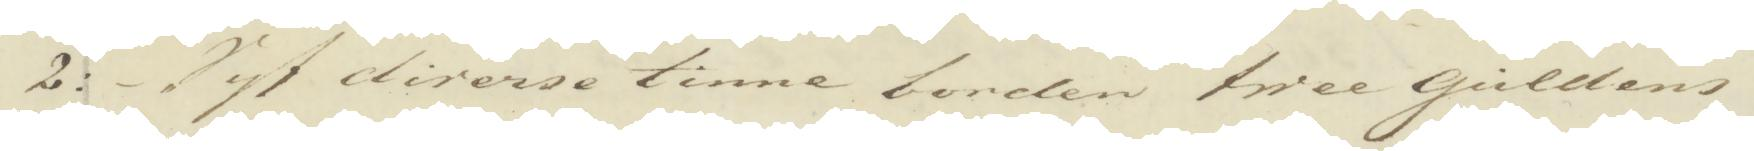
2:— Vyf diverse tinne borden twee guldens
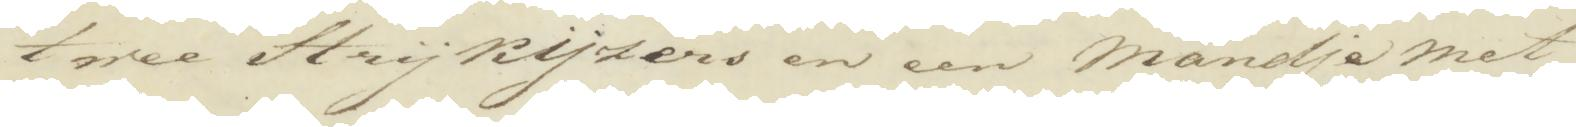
twee strijkijzers en een mandje met
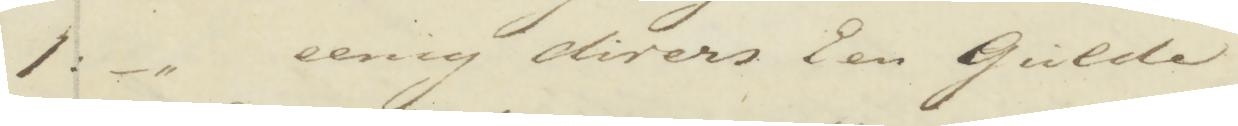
1: —„ eenig divers Een gulde
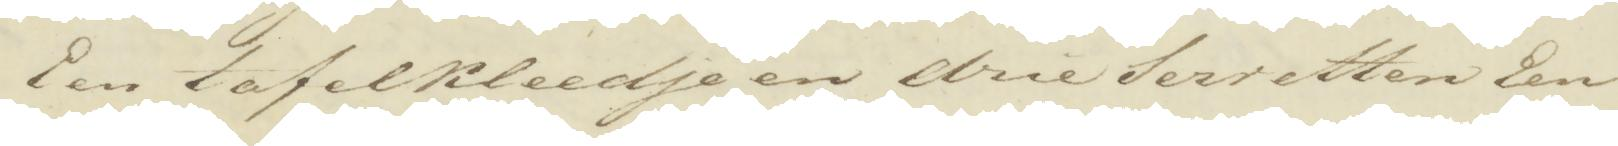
Een tafelkleedje en drie servetten Een
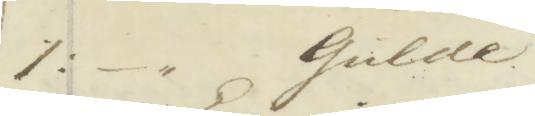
1:—„ gulde
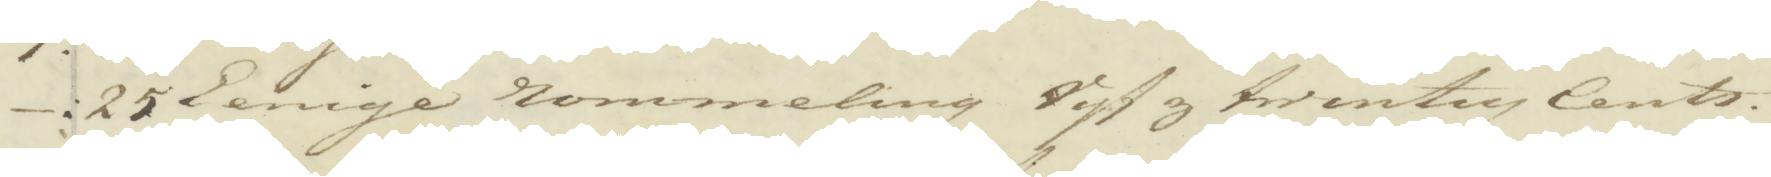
—: 25 Eenige rommeling Vyf en twintig Cents.
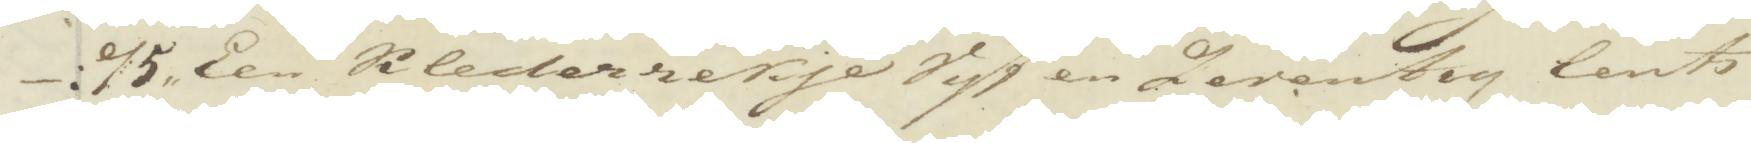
—:75„ Een klederrekje Vyf en Zeventig Cents
